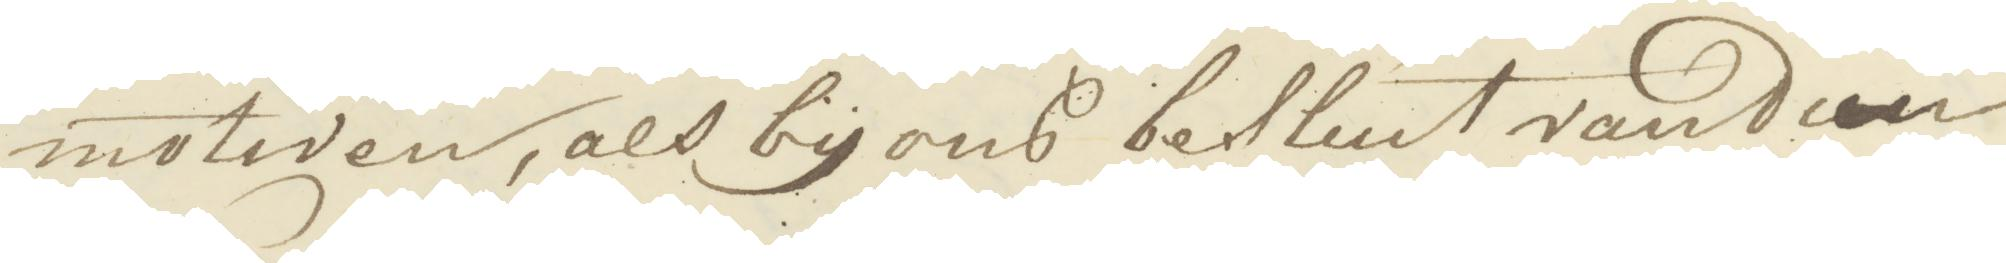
motiven, als bij ons besluit van dien
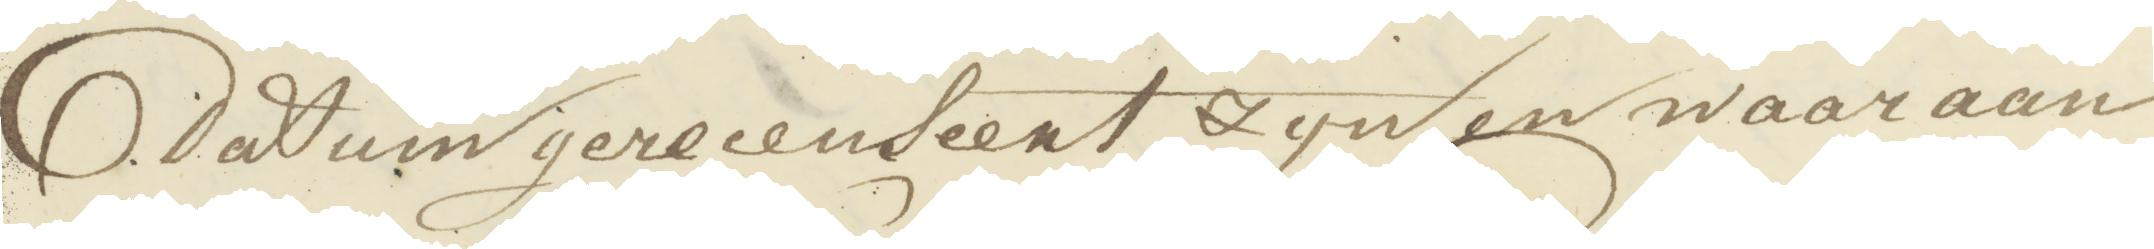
Datum gerecenseert zijn en waaraan
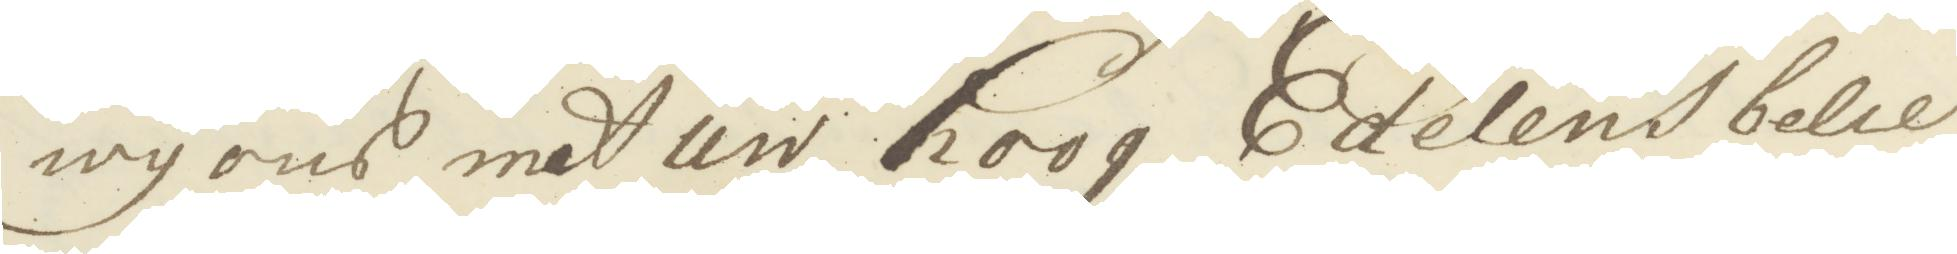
wij ons met uw hoog Edelens belie
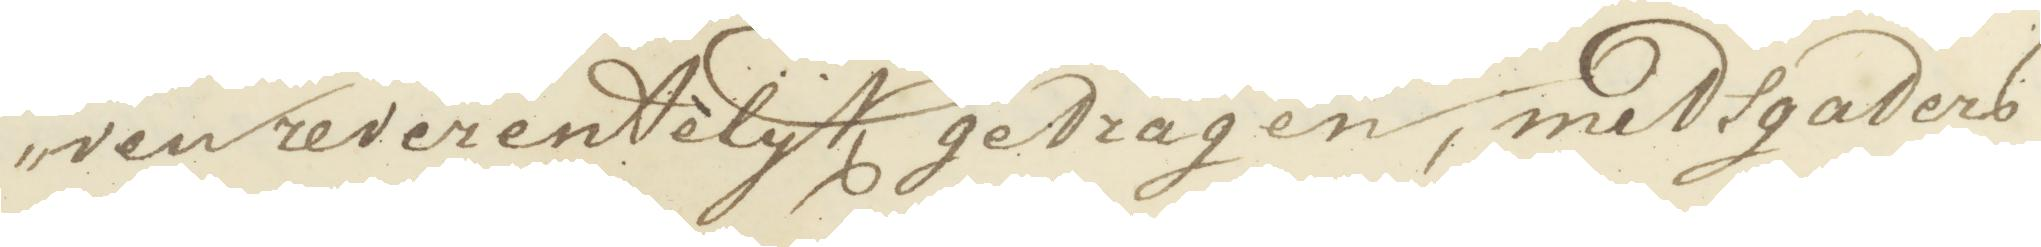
„ven reverentelijk gedragen, mitsgaders
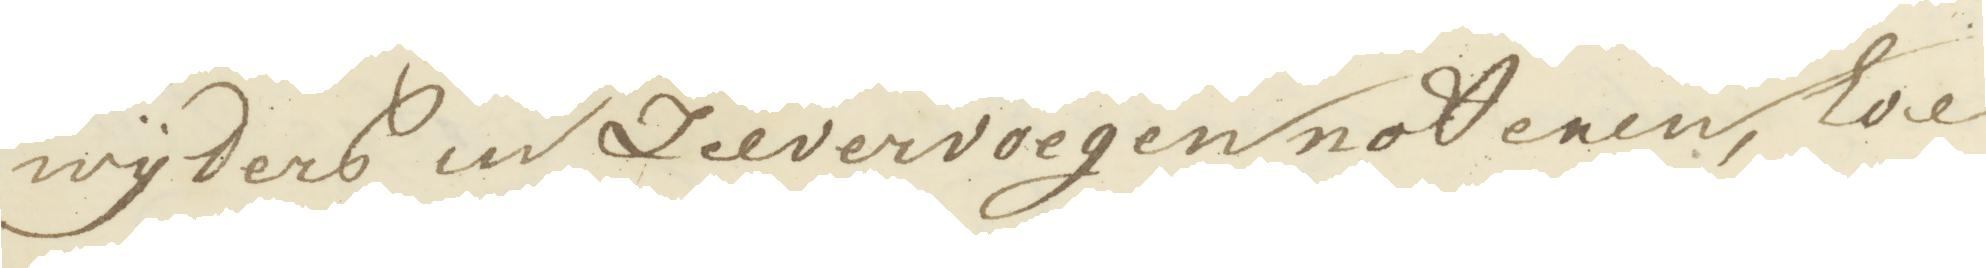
wijders in Zelver voegen noteren, hoe
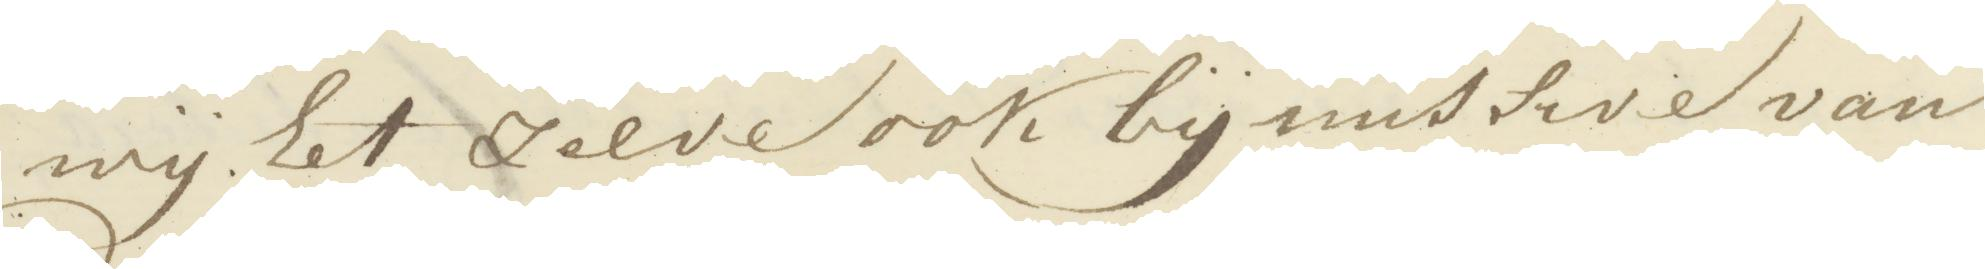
wij het zelve ook bij missive van
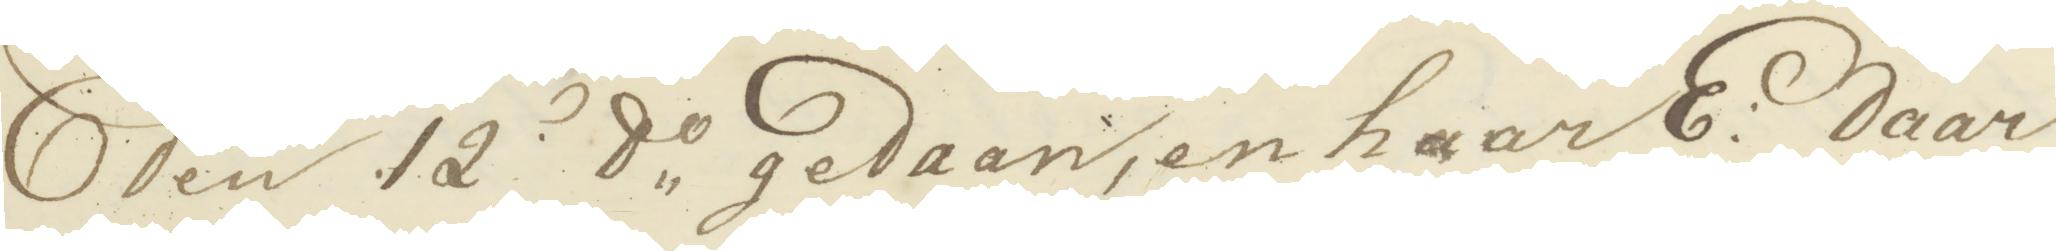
den 12.' d„o gedaan, en haar E: daar
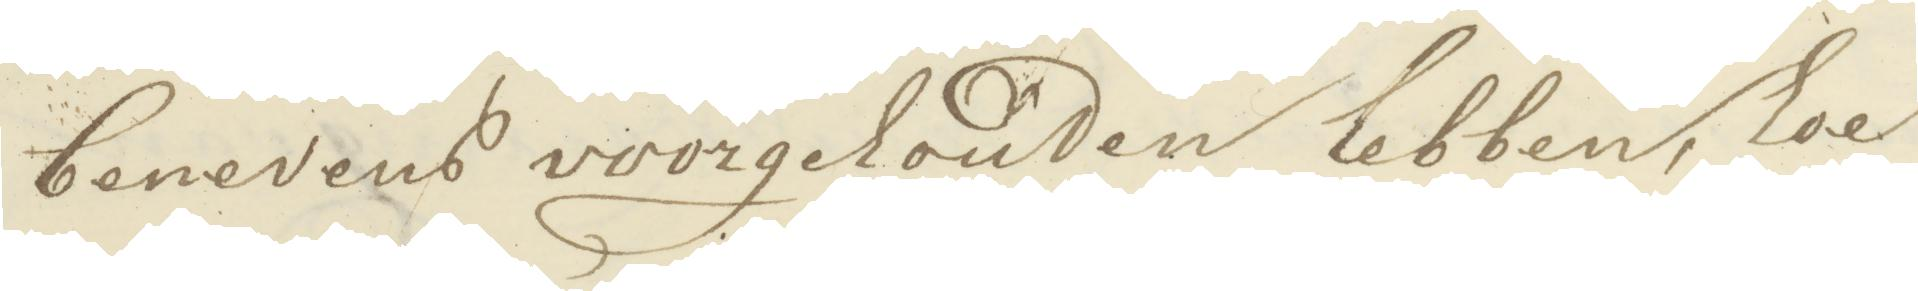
benevens voorgehouden hebben, hoe
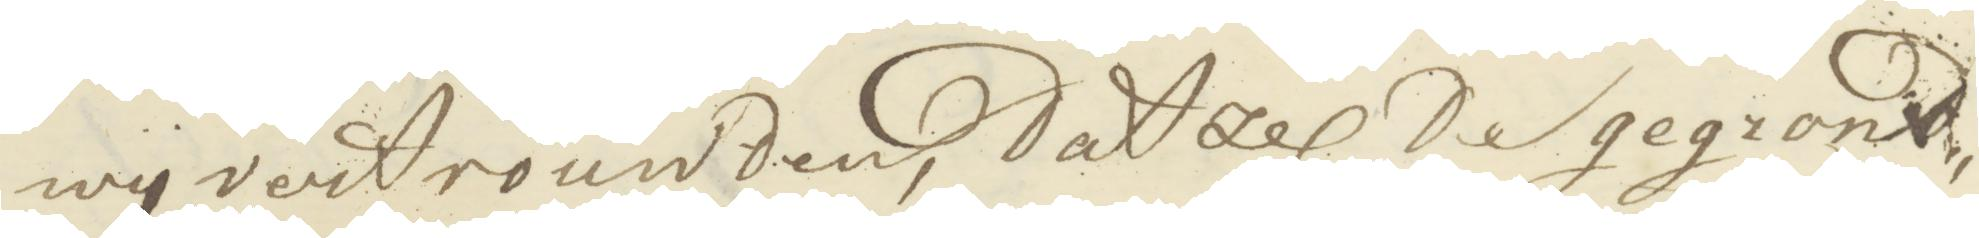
wij vertrouwden, dat ze de gegront„
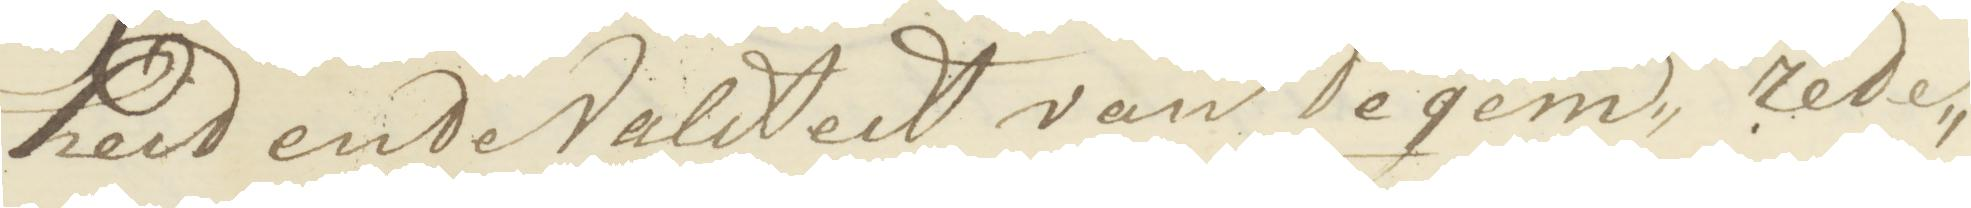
heid ende Valiteit van de gem„te rede„
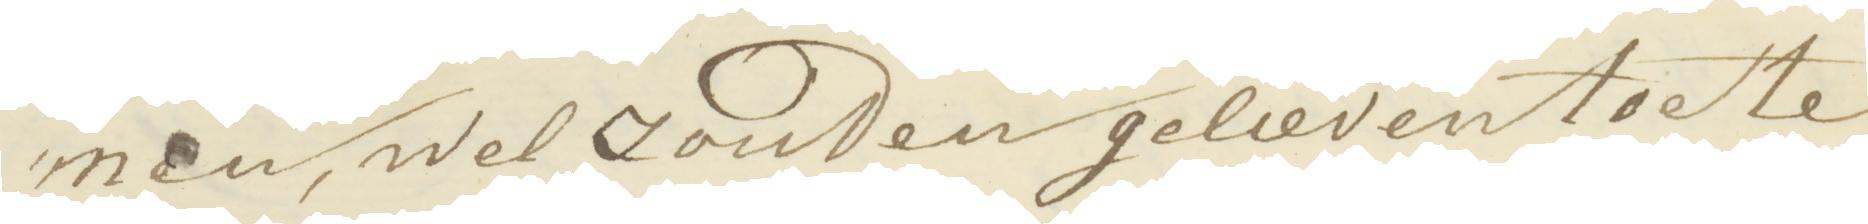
„nen, wel zouden gelieven toe te
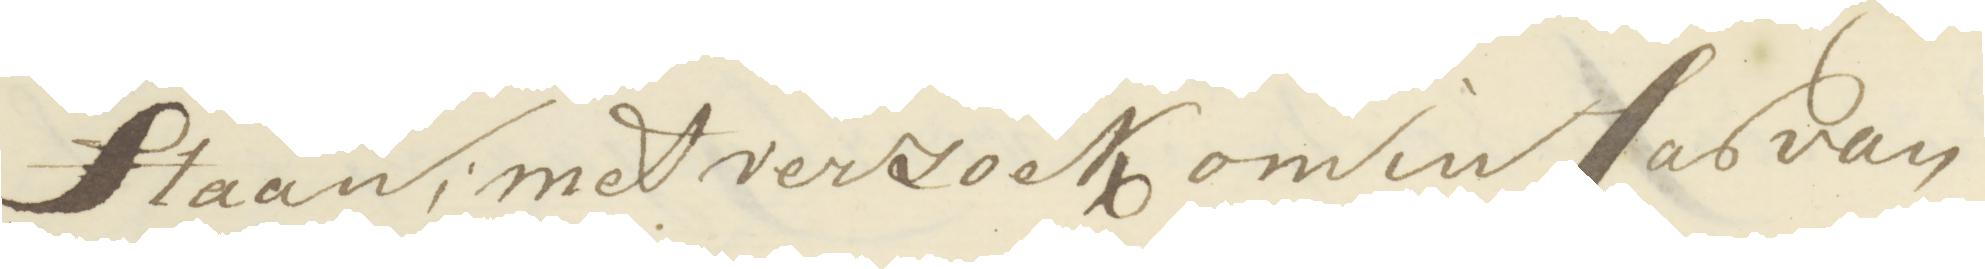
Staan, met verzoek om in Cas van
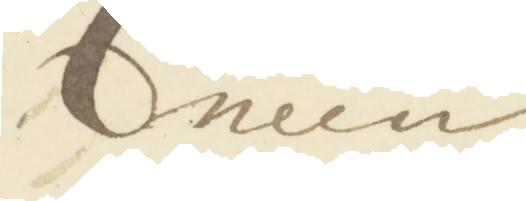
neen
